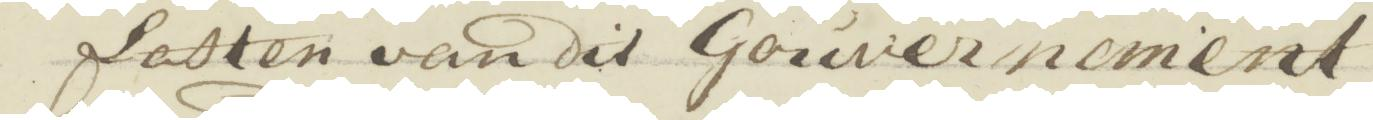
Lasten van dit Gouvernement
